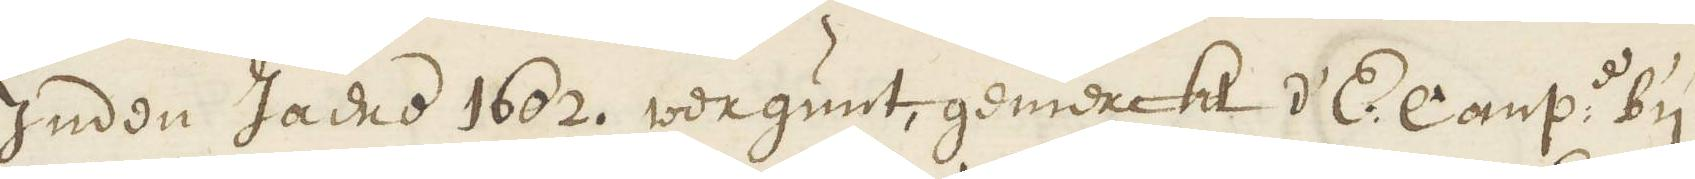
Jnden Jaere 1602. vergunt, gemerckt d’E: Comp:e bij
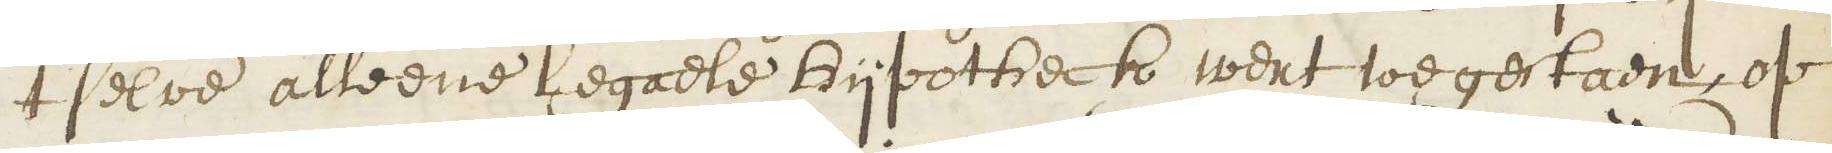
tselve alleene legaele hijpotheck wert toegestaen, of
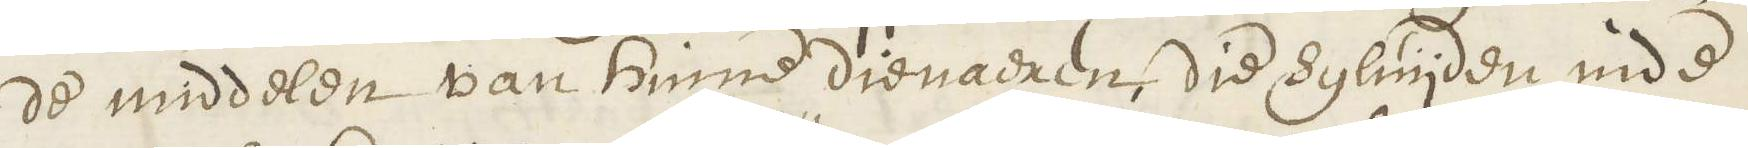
de middelen van hunne dienaeren, die sy luijden inde
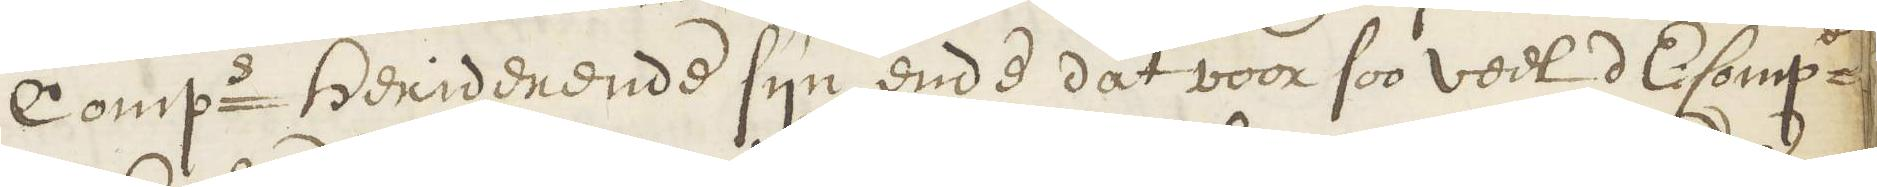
Comp=s heriderende sijn, ende dat voor soo veel d E: Comp=e
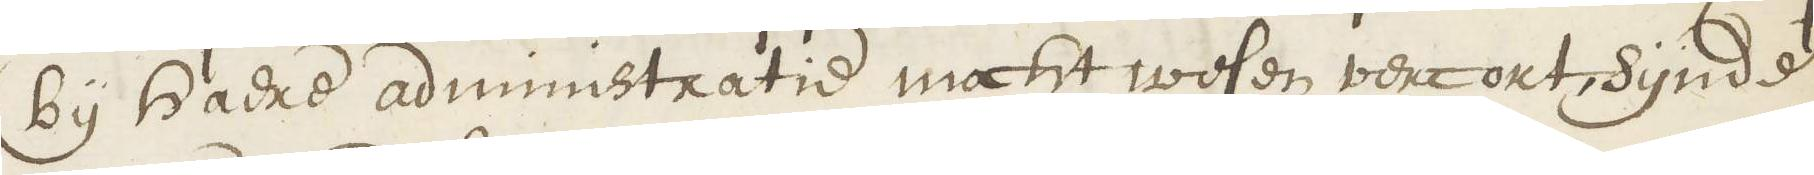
bij haere administratie mocht wesen vercort, sijnde
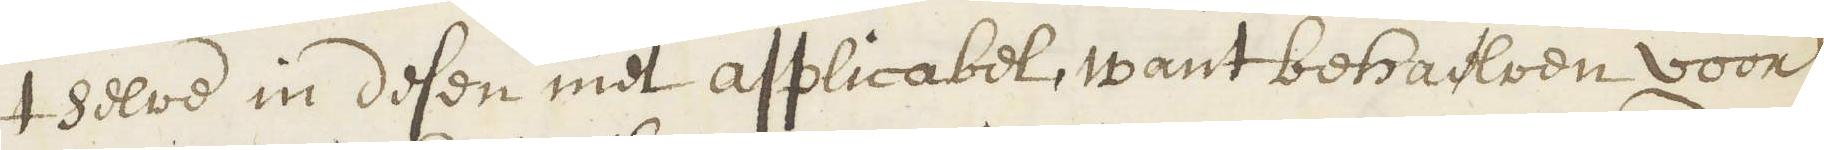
t selve in desen met applicabel, want behaelven voor
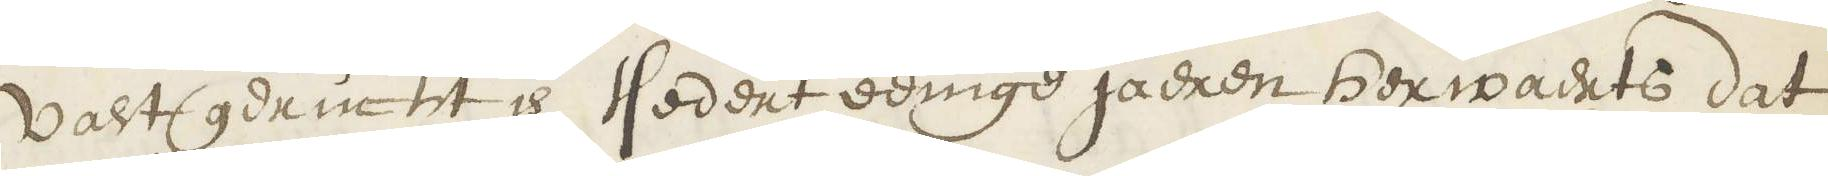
vastgerucht is tsedert eenige jaeren herwaerts dat
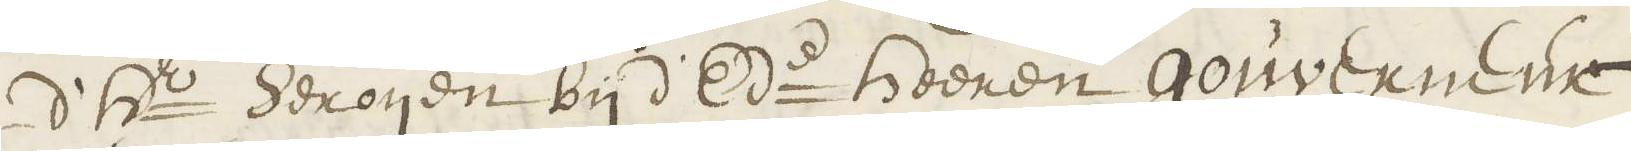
d’ h=r seroijen bij d’Ed=e heeren gouverneur
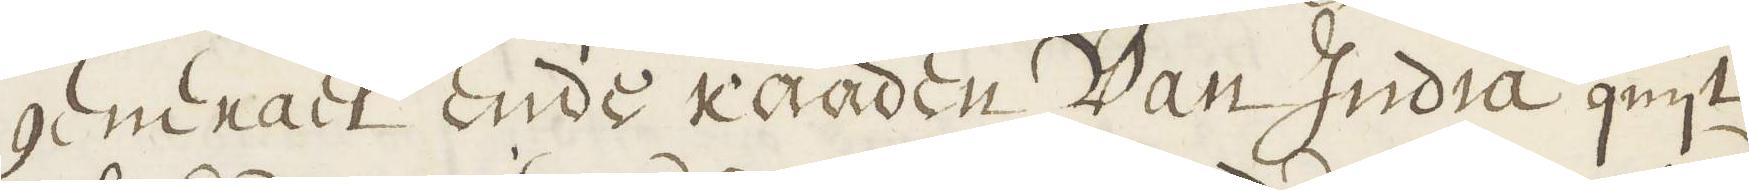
generael ende raaden van Jndia quijt
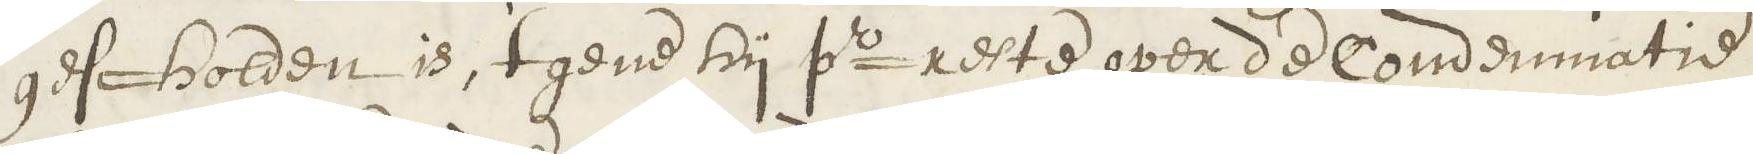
gescholden is, ’t gene hij p=r reste over de Condemnatie
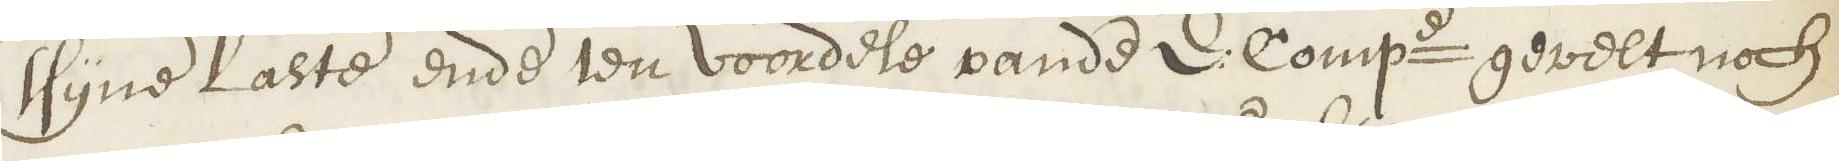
tsijne laste ende ten voordele vande E: Comp=e gevelt noch
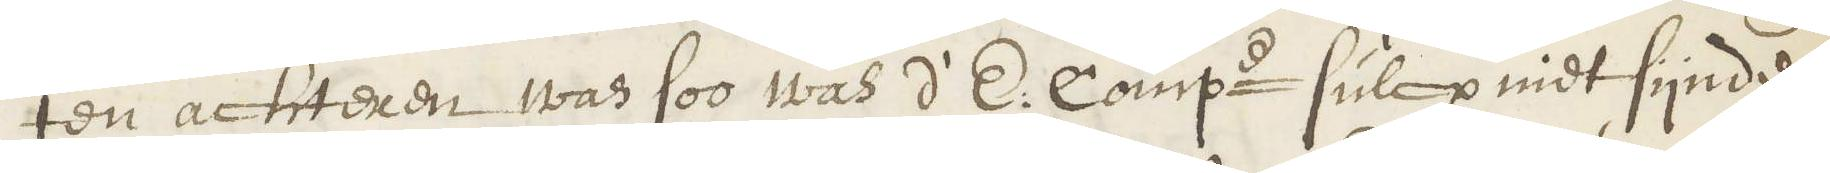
ten achteren was soo was d’ E: Comp=e sulcx niet sijnde,
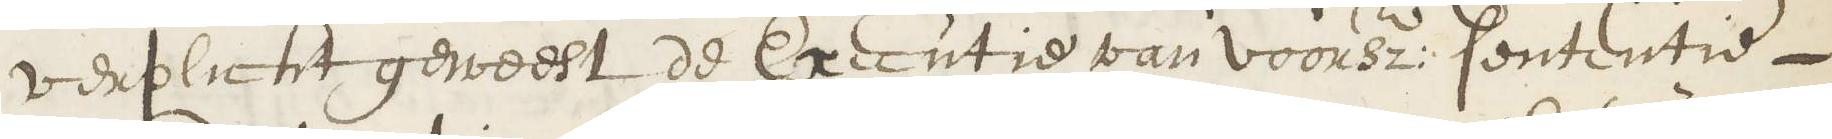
verplicht geweest de Executie van voorsz: sententie
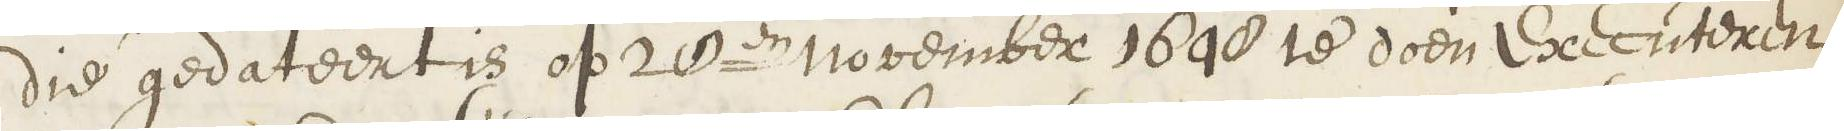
die gedateert is op 28=en november 1648 te doen Executeren
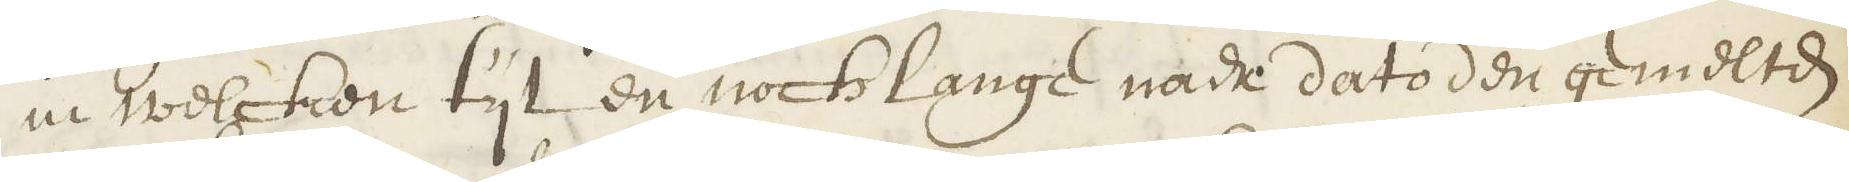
in welcken tijt en noch lange naer dato den gemelten
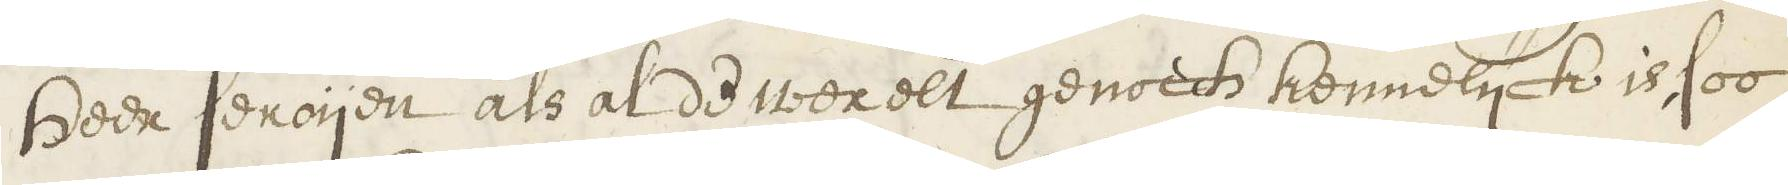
heer seroijen als al de werelt genoech kennelijck is, soo
